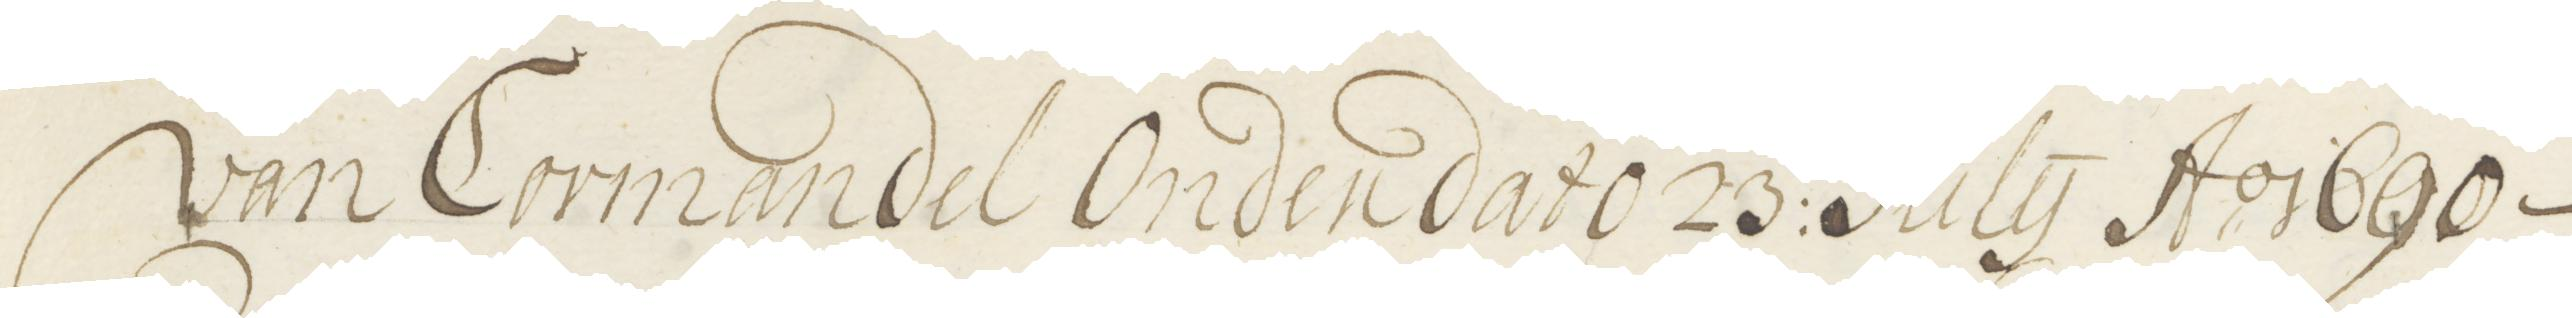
Van Cormandel Onder dato 23:' Iulij A„o 1690.—
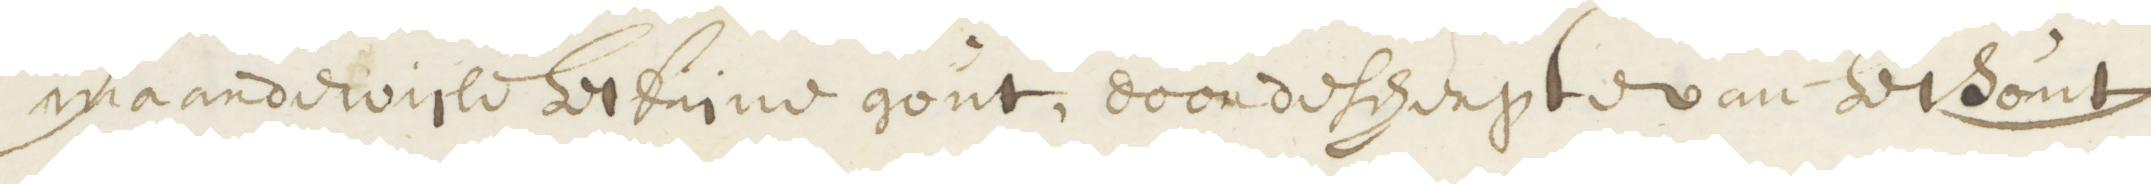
maardewijle het fijne gout, door de scherpte van het hout
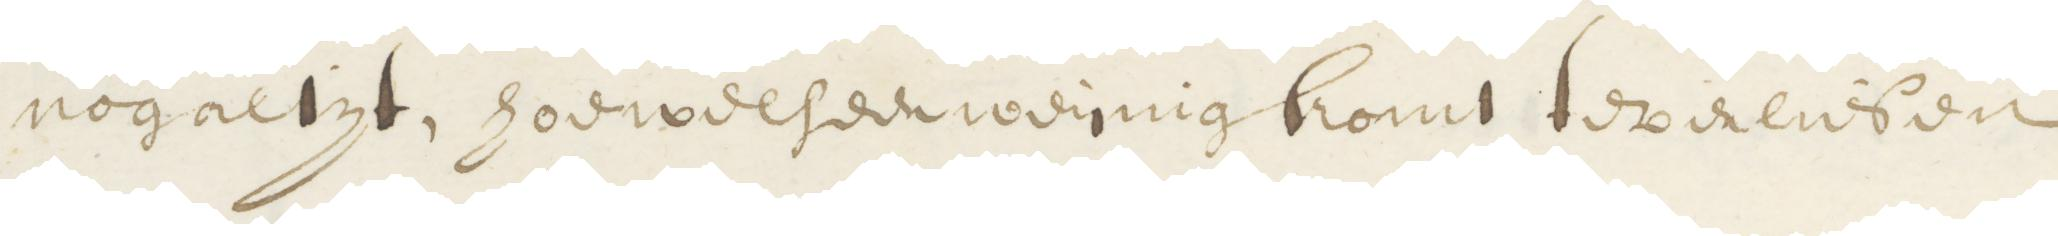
nog altijt, hoewel seer weijnig komt te verliesen
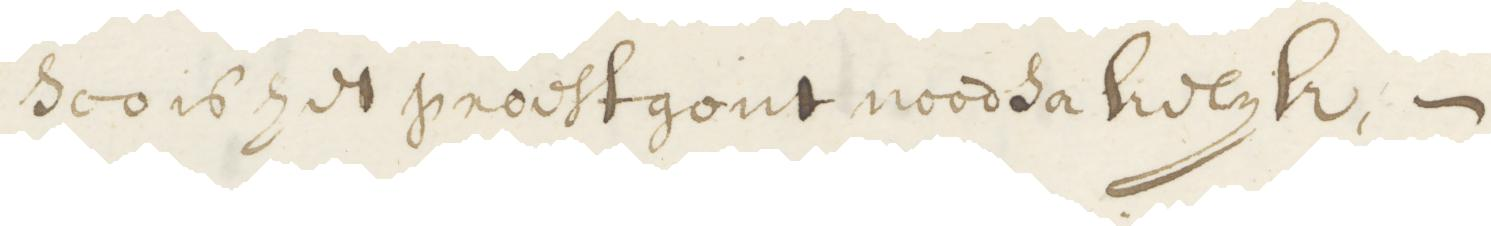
soo is het proeffgout noodsakelijk,—
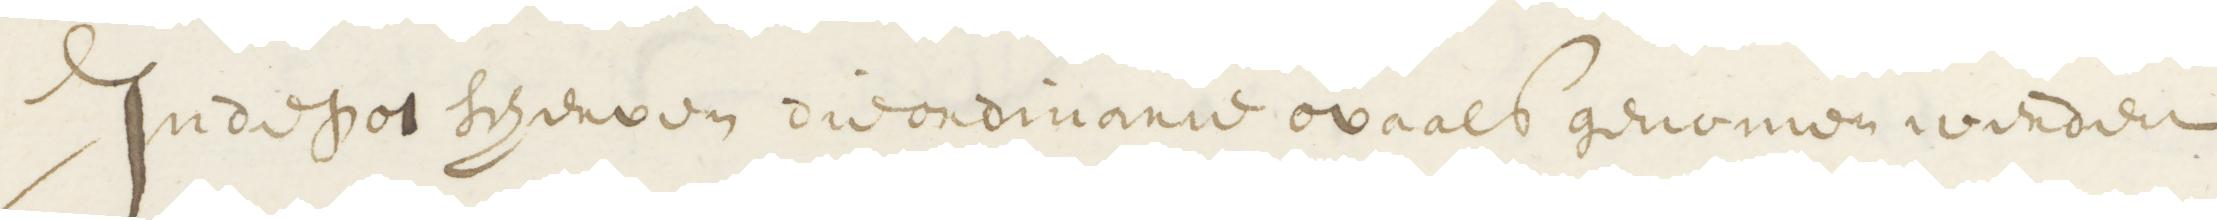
In depot scherven die ordinarie ovaals genomen werden
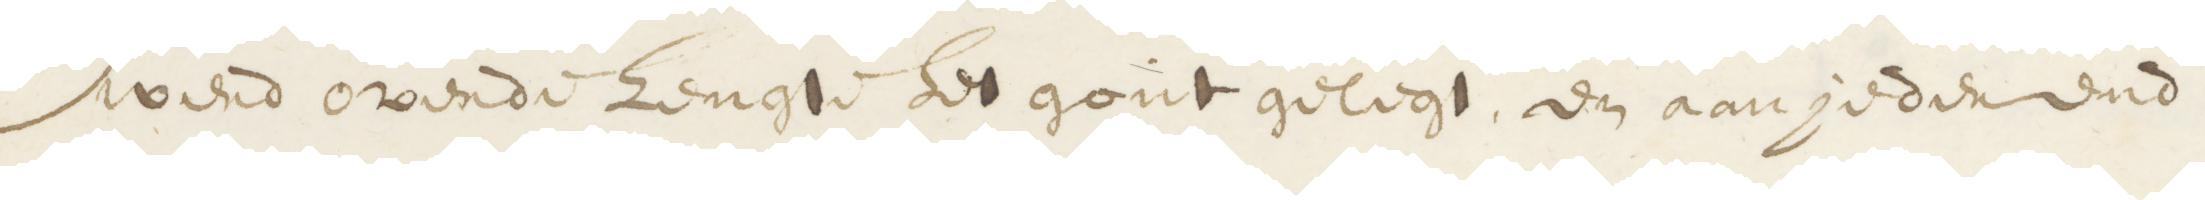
werd over de Lengte het gout gelegt, en aan jeder end
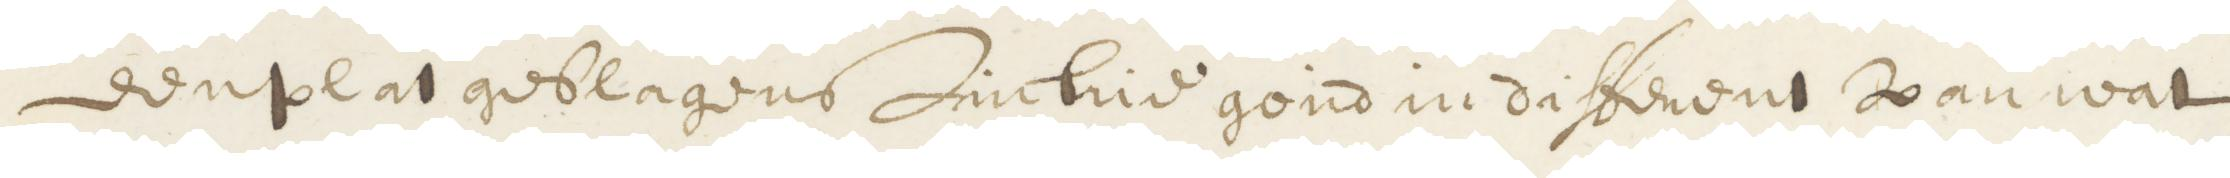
een plat geslagen stuckie goud in different van wat
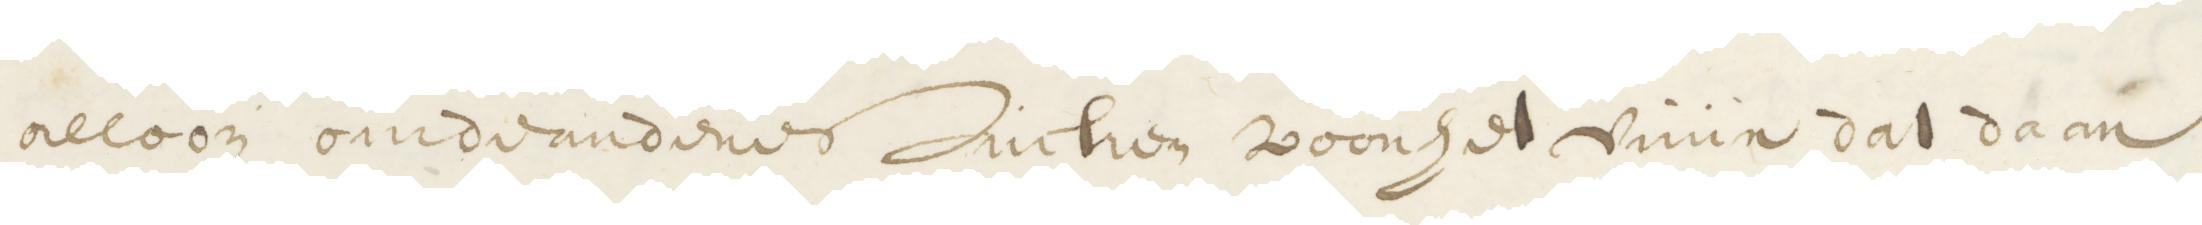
allooy om de andere stucken voor het vuur dat daar
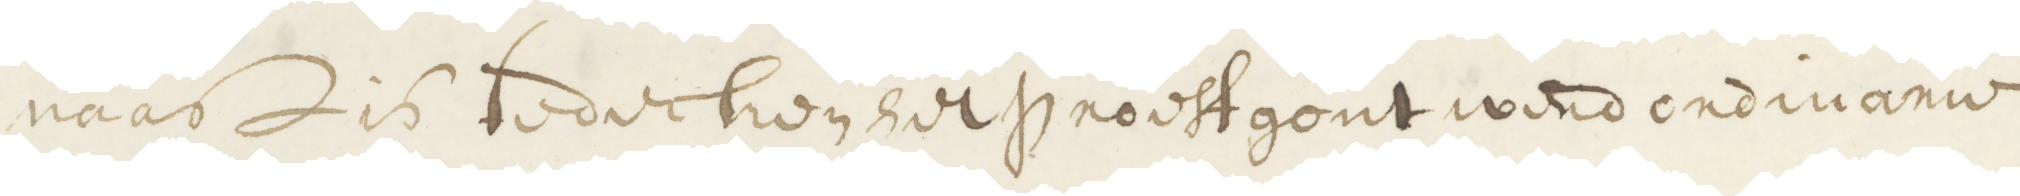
naast is te decken, het proeffgout werd ordinarie
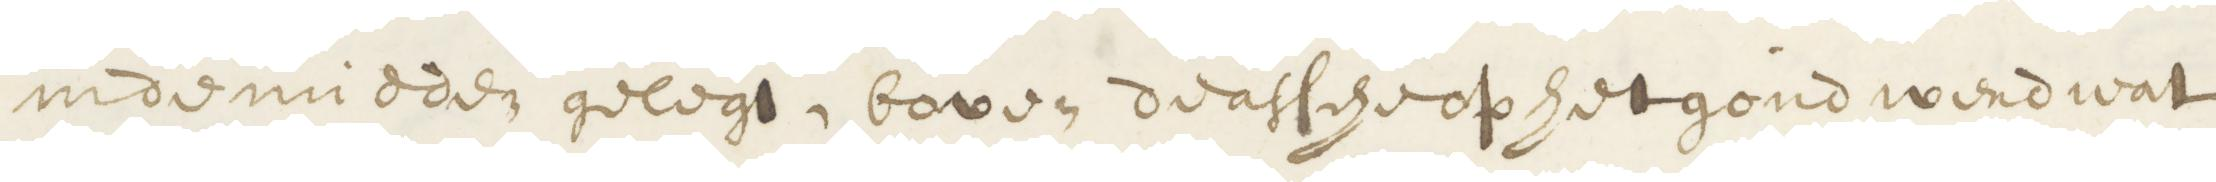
in de midden gelegt, boven deassche op het goud werd wat
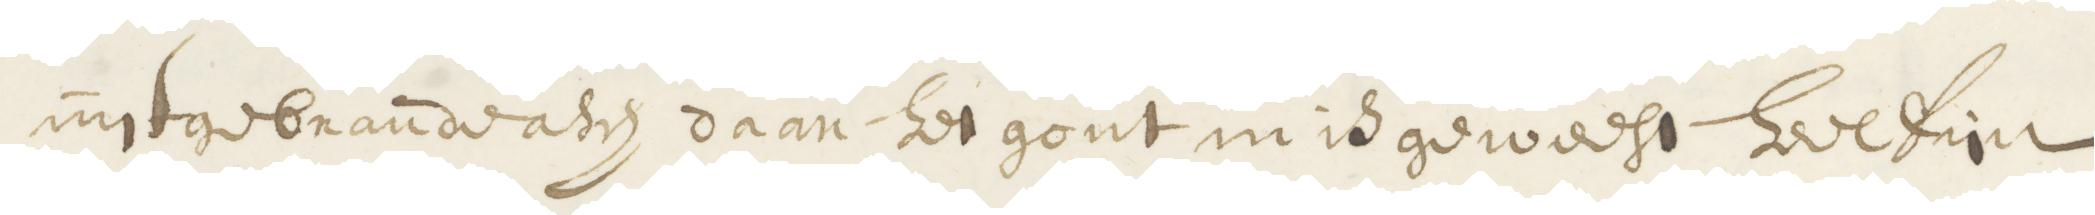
uijt gebrande asch daar het gout in is geweest heel fijn
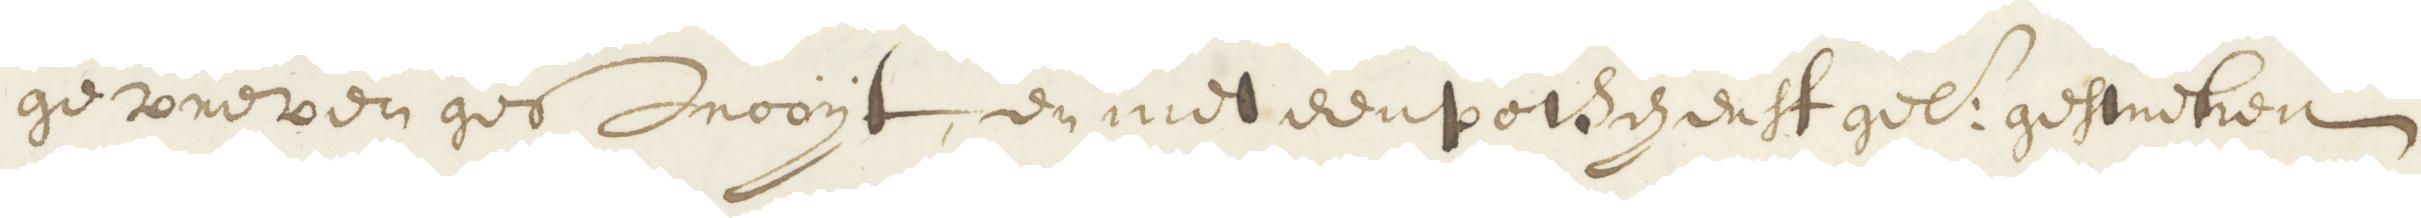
gevreven gestrooijt, en met een potscherff gelijk gestreken
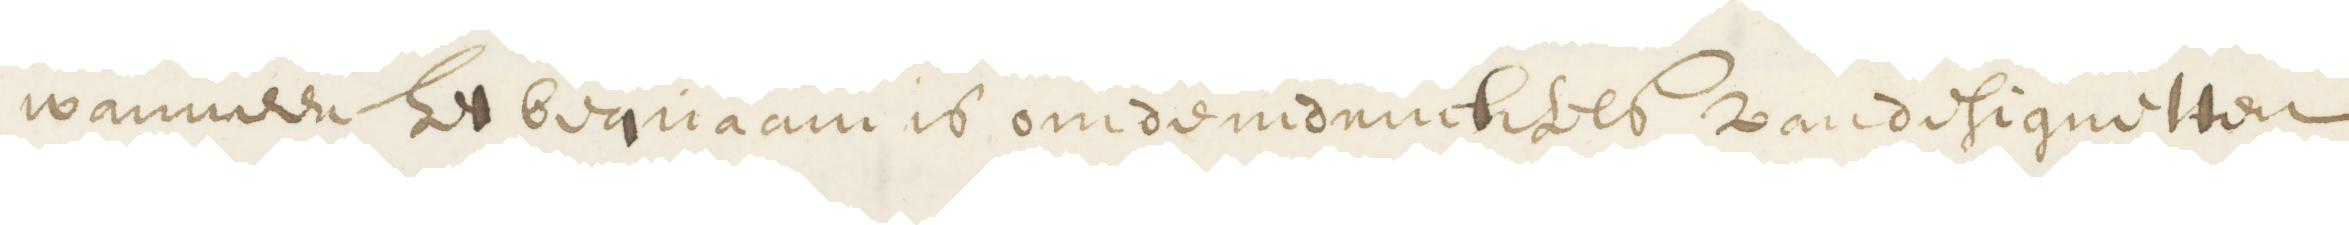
wanneer het bequaam is om de indrucksels van de fignetten
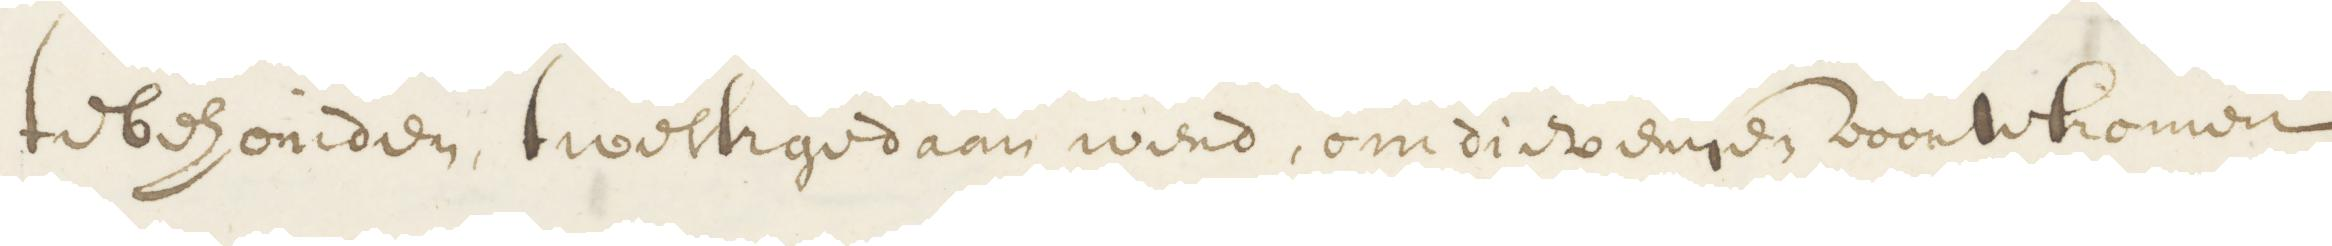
te behouden, t welk gedaan werd, om dieverijen voor te komen
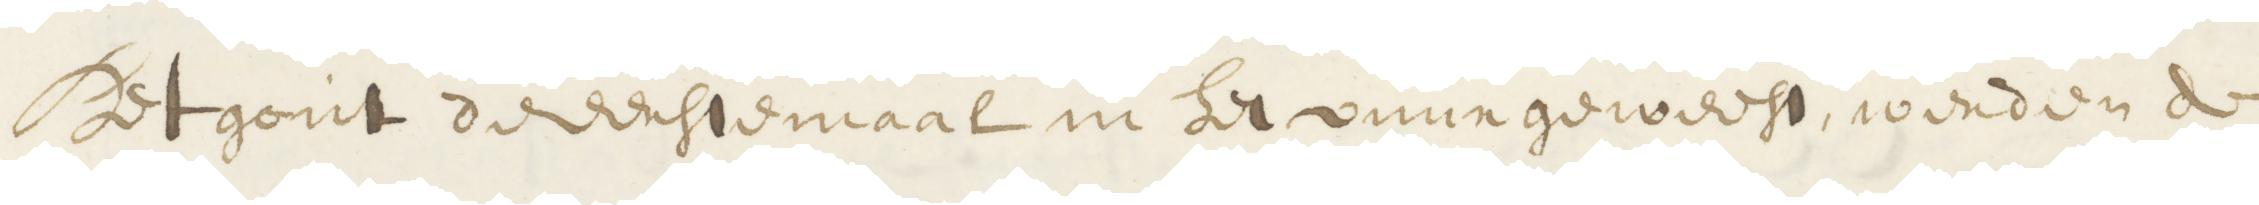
Het gout de eerstemaal in het vuur geweest, werden de
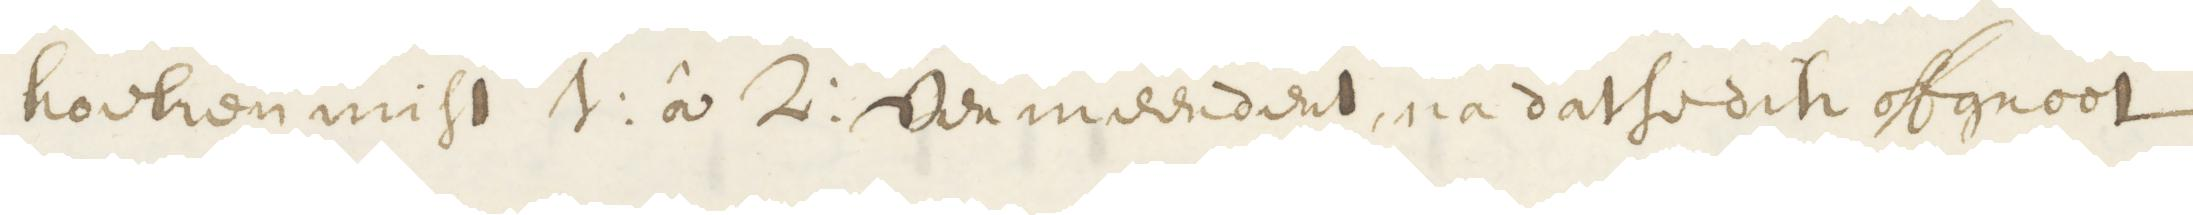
hoeken mist 1: â 2: vermeerdert, na datse dik off groot
